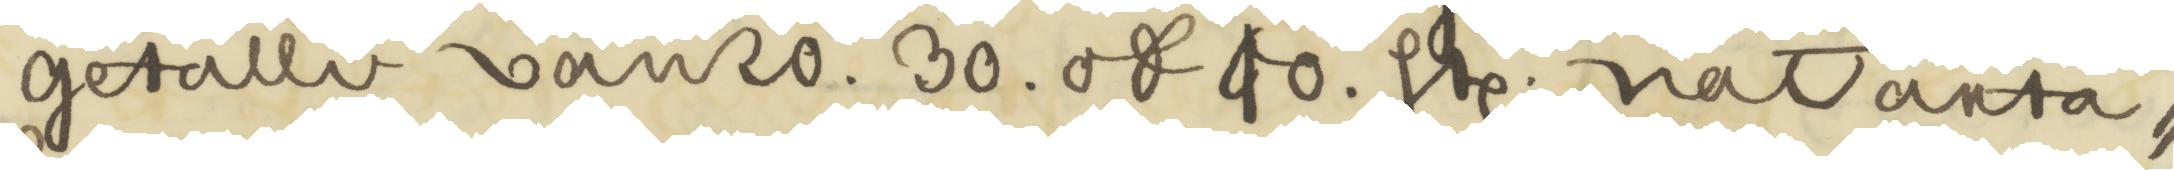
getalle van 20. 30. of 40. stx: na Carta„
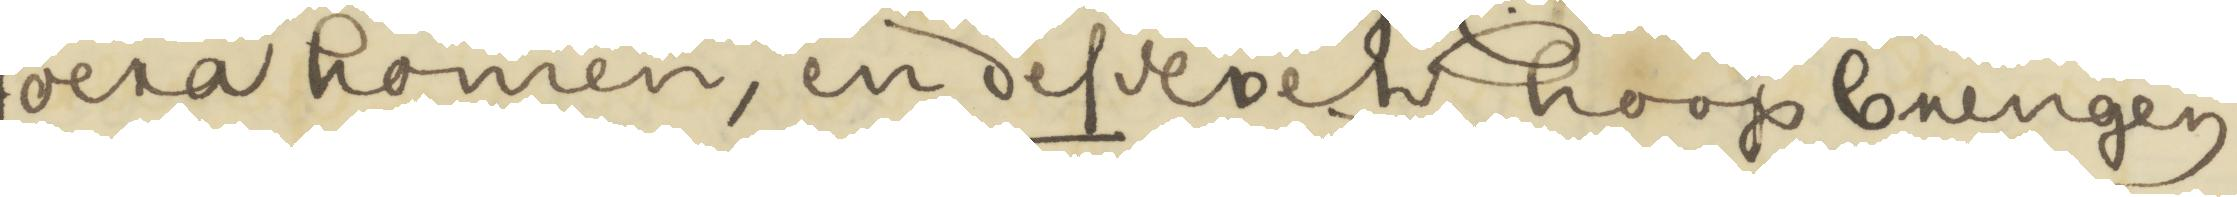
oera komen, en deselve te koop brengen
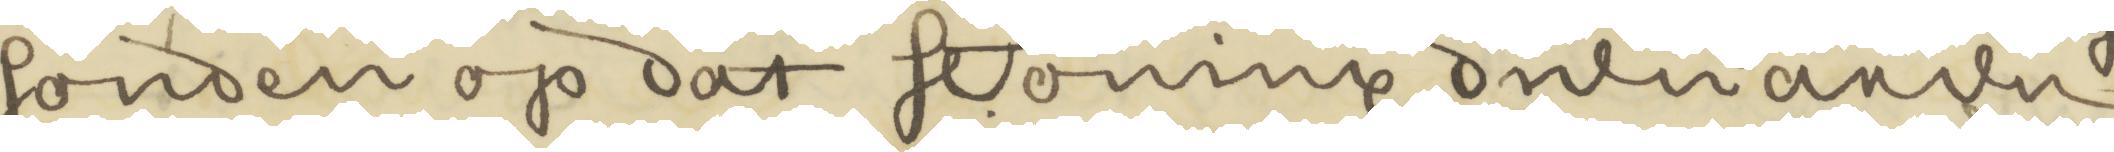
souden op dat sConinx dienaren
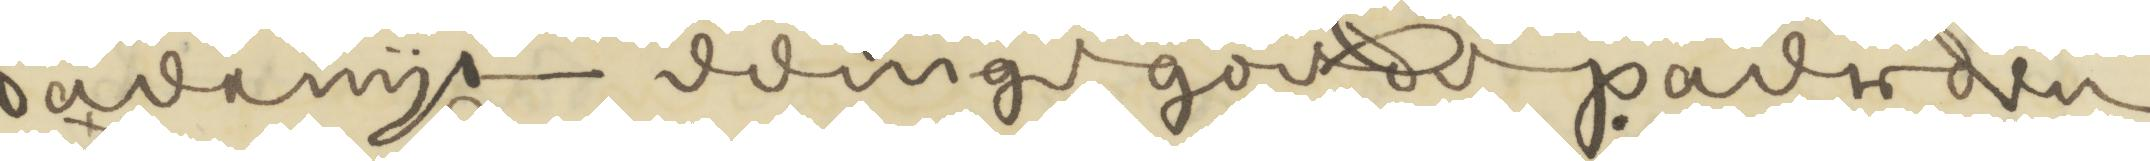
daeruijt eenige goede paerden
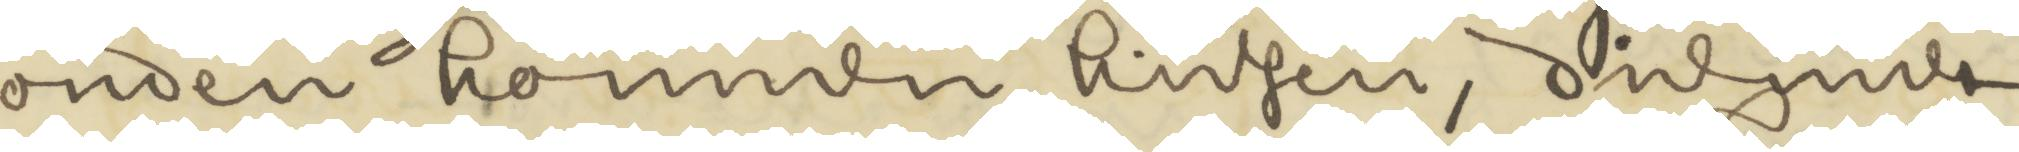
ouden konnen kiesen, die met
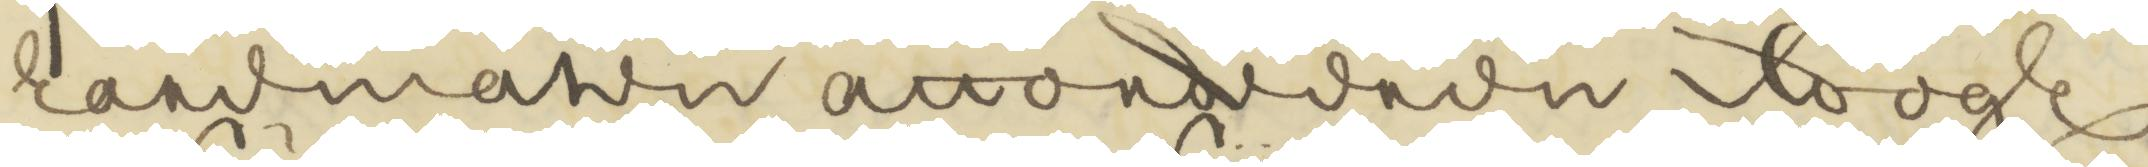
harematen accordeeren Edogh
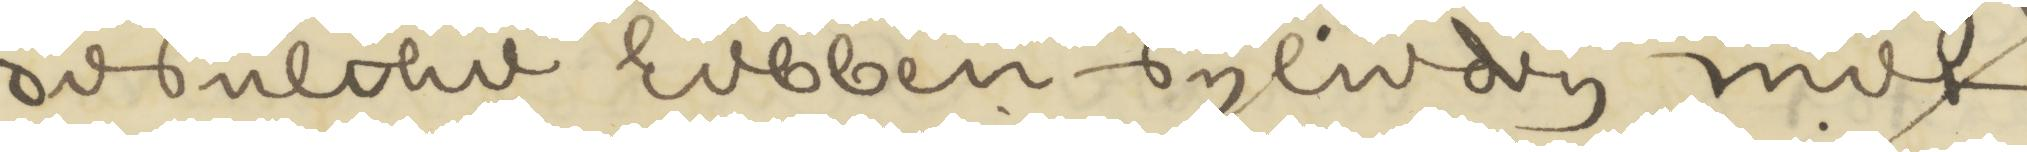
desulcke hebben sijlieden niet
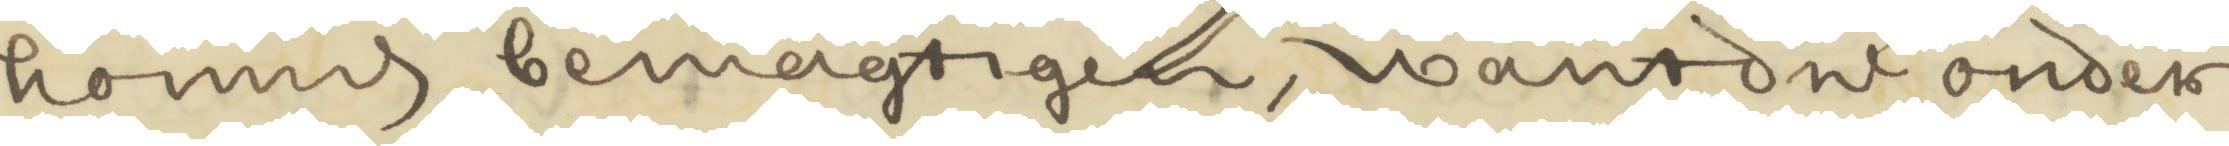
konnen bemagtigen, want die onder
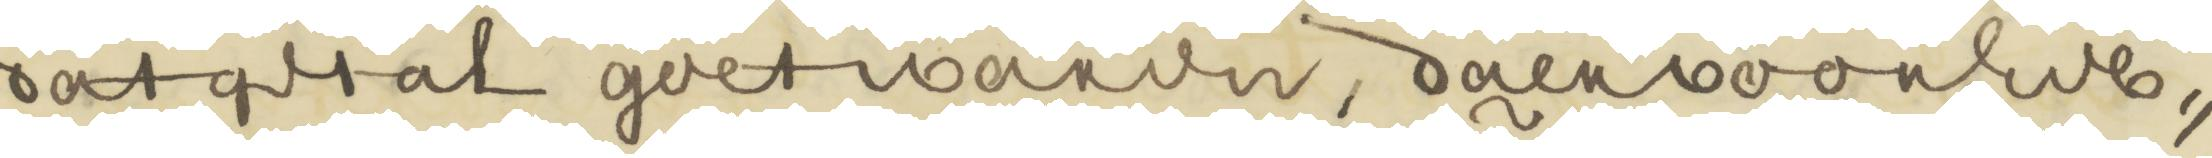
dat getal goet waren, daer voor heb„
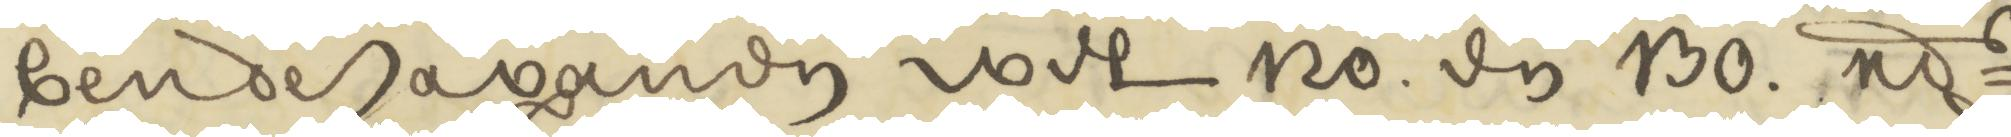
bende Javanen wel 120. ende 130. rd=s
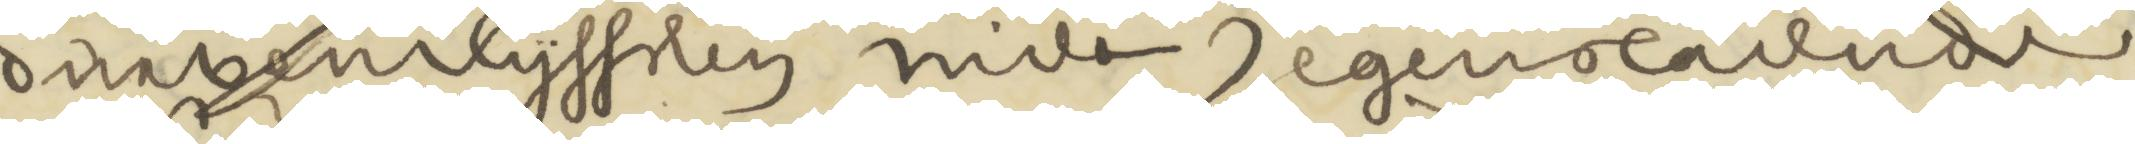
durven Eijsschen niet Jegenstaende
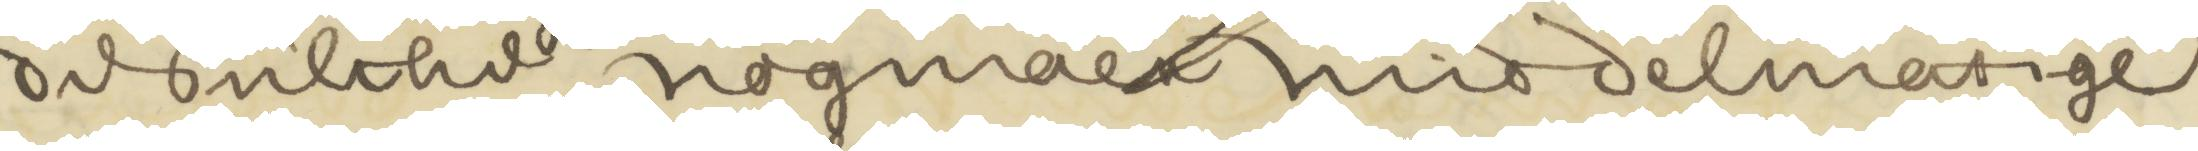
desulcke nog maer middelmatige
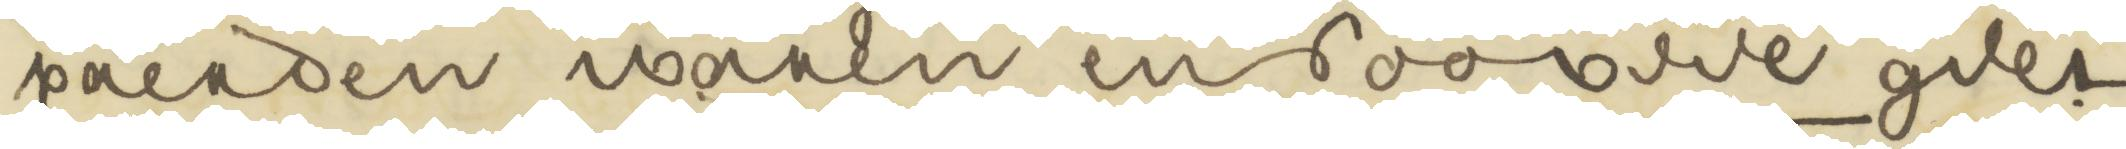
paerden waren en soo veel gelt
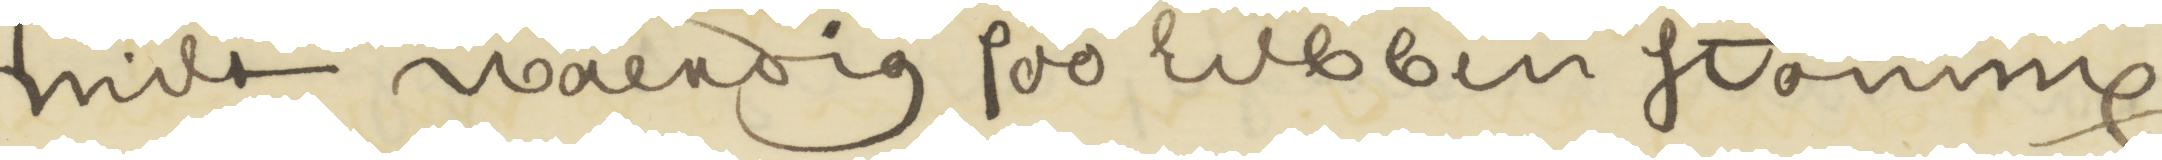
niet waerdig soo hebben sConinx
